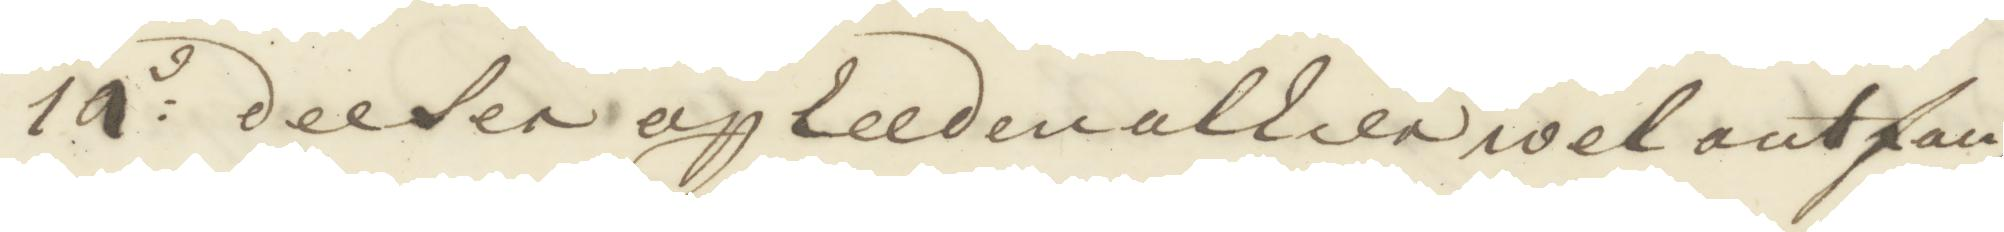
14:e deeser op heeden alhier wel ontfan
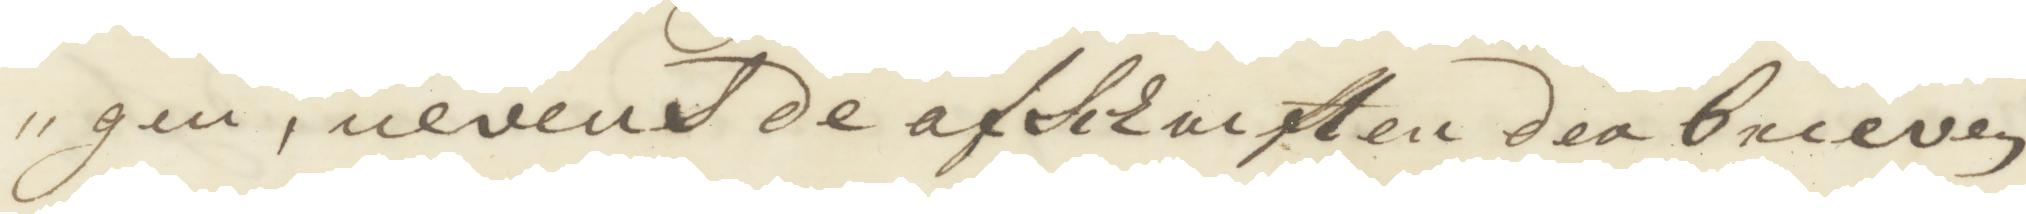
„gen, nevens de afschriften der brieven
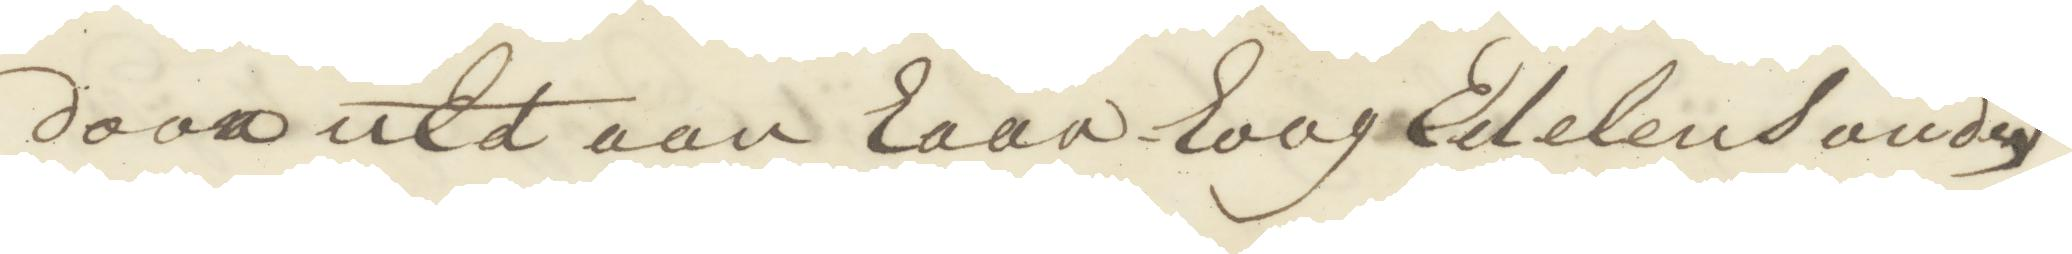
door uEd aan haar hoog Edelens onder
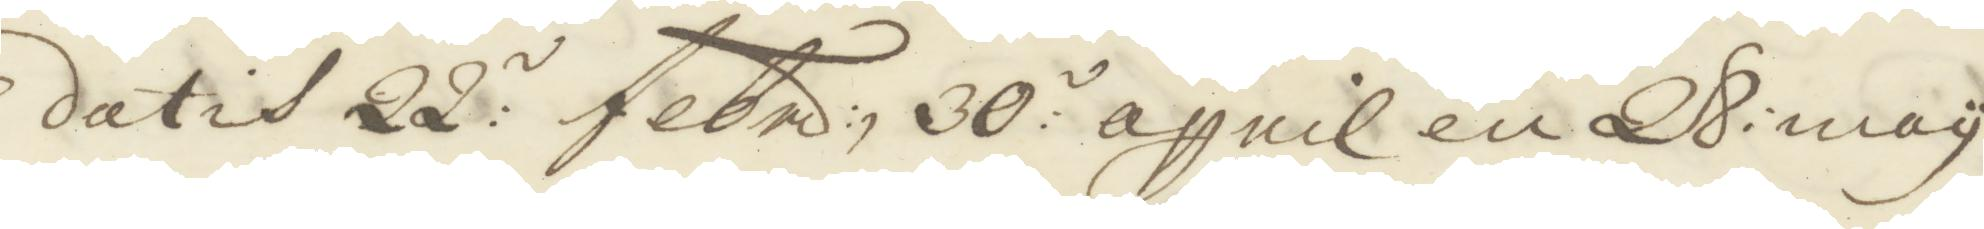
datis 22:e febr:, 30:e april en 28: maij
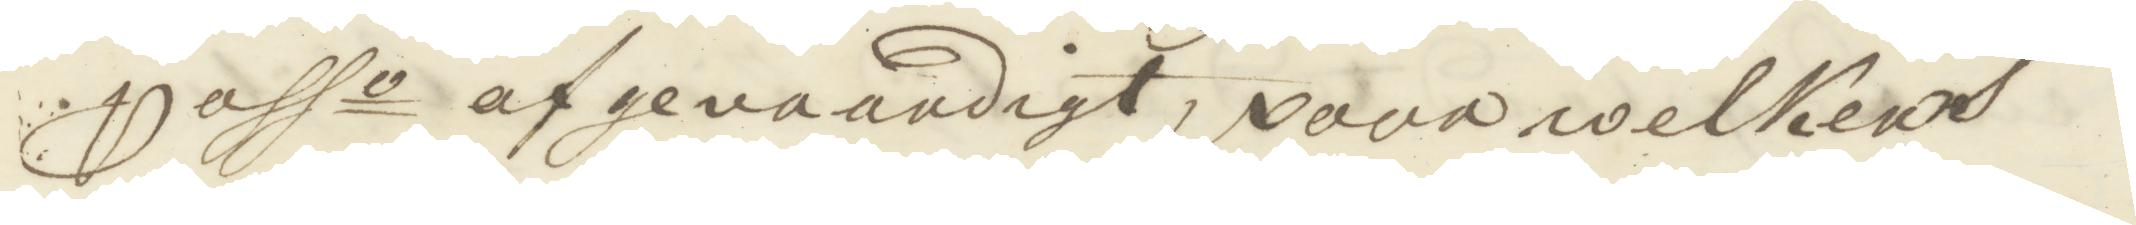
pass=o afgevaardigt, voor welkers
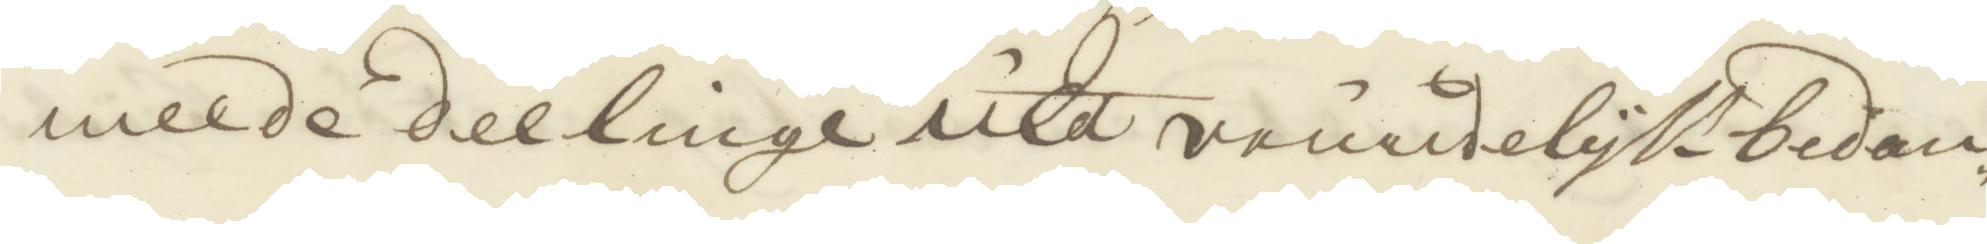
meededeelinge uEd vrundelijk bedan„
